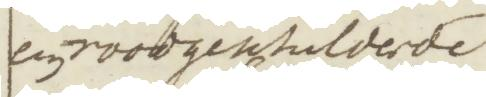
een rood geschilderde
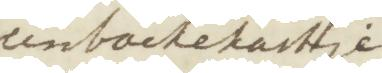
een boekekastje
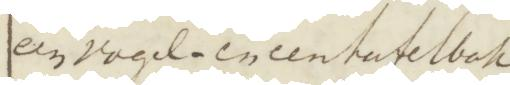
Een Vogel- en een tatelbak
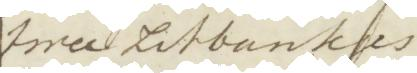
twee Zitbankjes
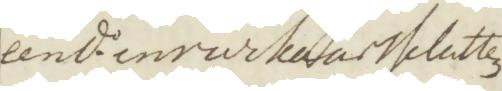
een d.o invur kaarsjelatten
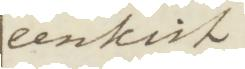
een kist
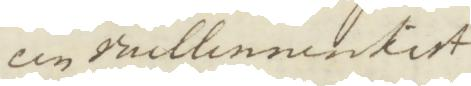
een vuillinnenkist
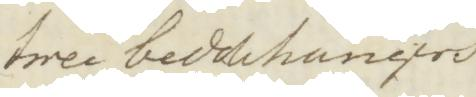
twee beddehangers
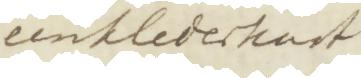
een klederkast
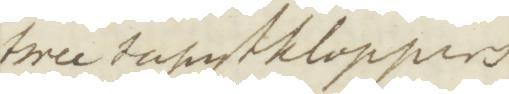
twee tapytkloppers
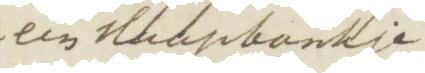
een slaapbankje
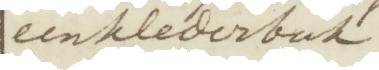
een klederbak
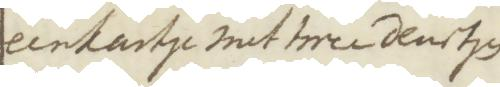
een kastje met twee deurtjes
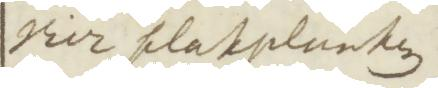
Vier plakplinten
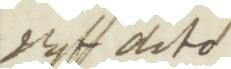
Vyff dito
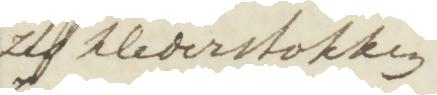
zes klederstokken
